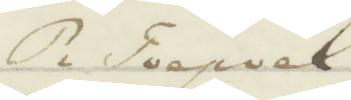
P: Toepoel
